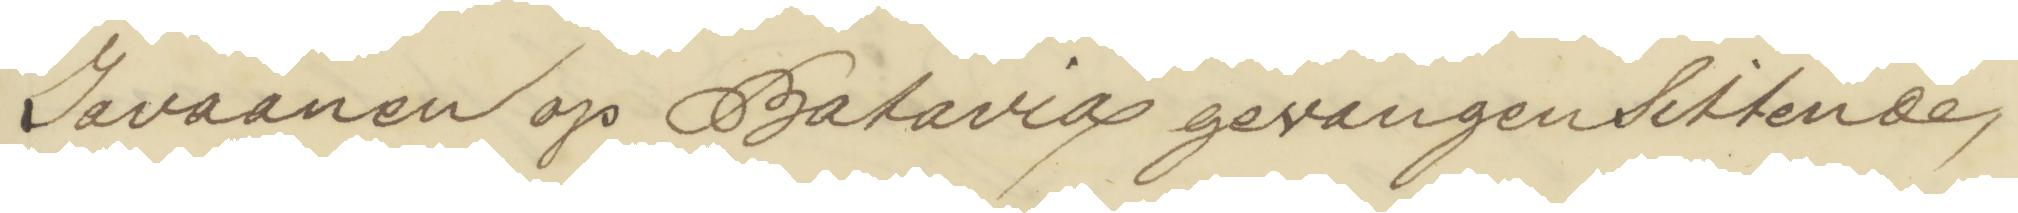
Iavaanen op Batavia gevangen sittende,
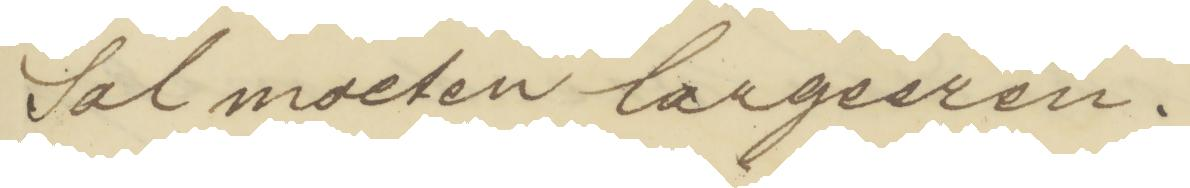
sal moeten largeeren.
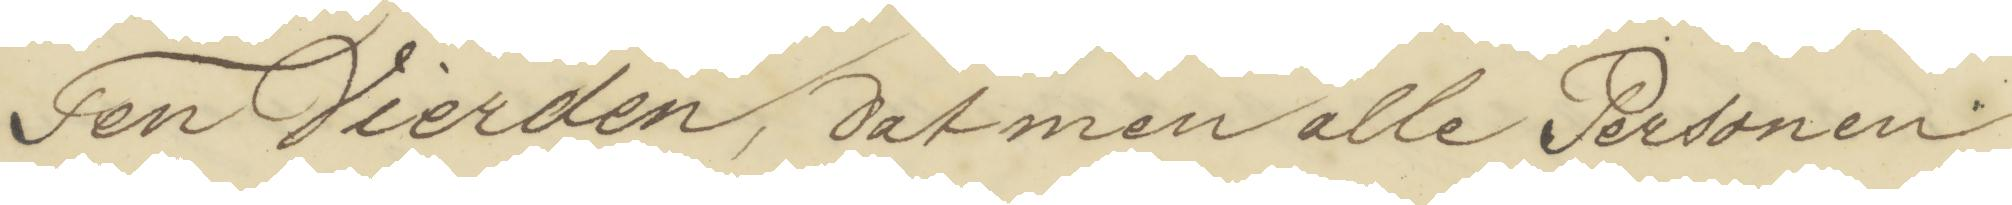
Ten Vierden, dat men alle Personen
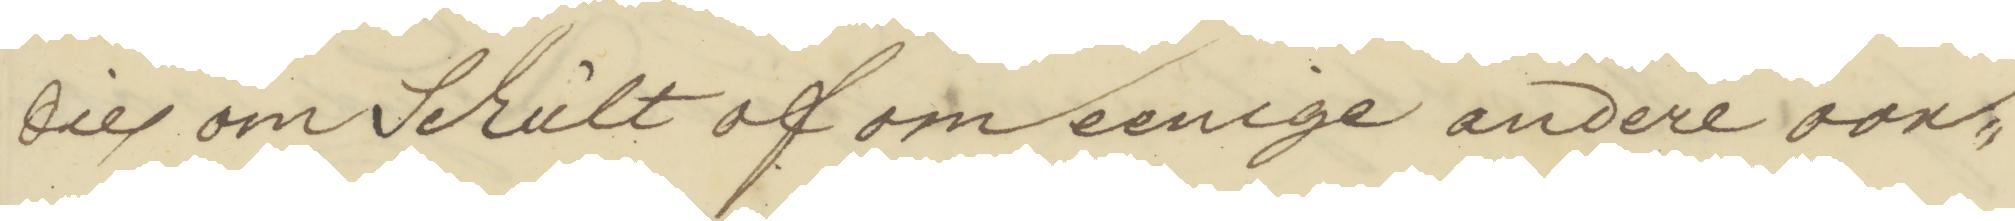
die om schult of om eenige andere oor„
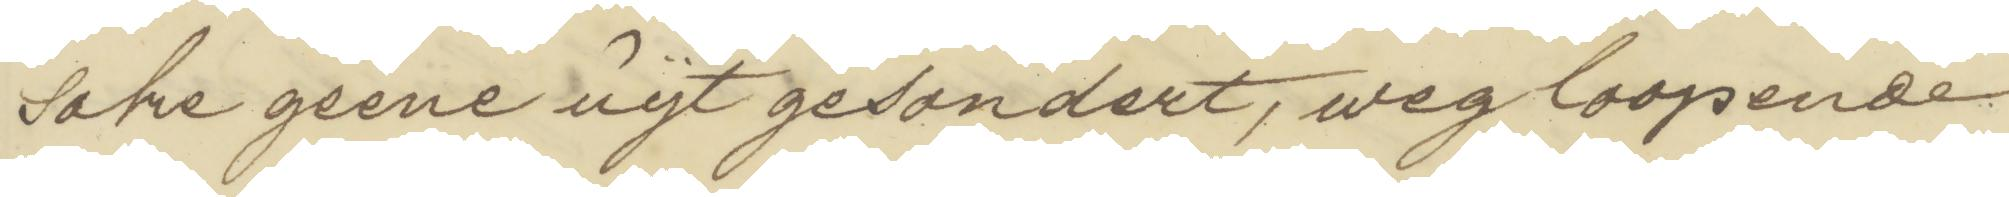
sake geene uijt gesondert, weg loopende
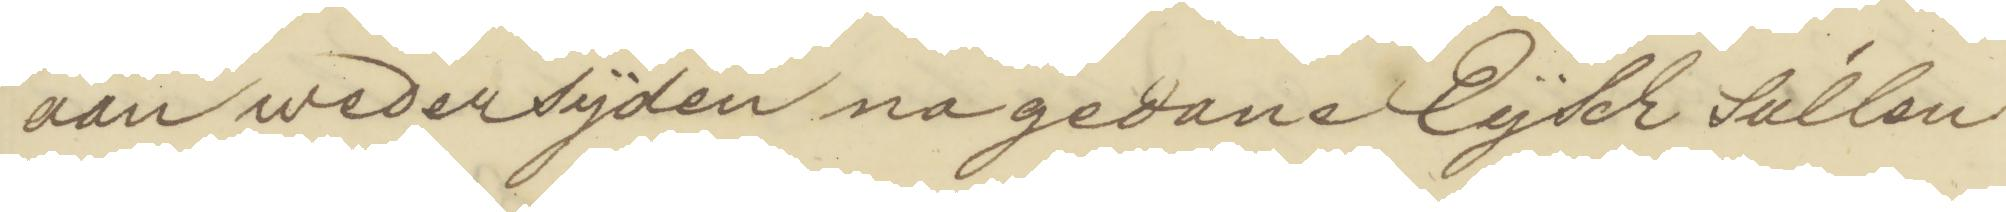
aan wedersijden na gedane Eijsch sullen
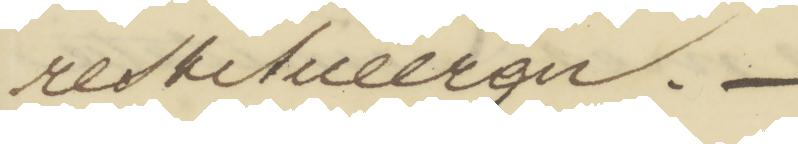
restitueeren. —
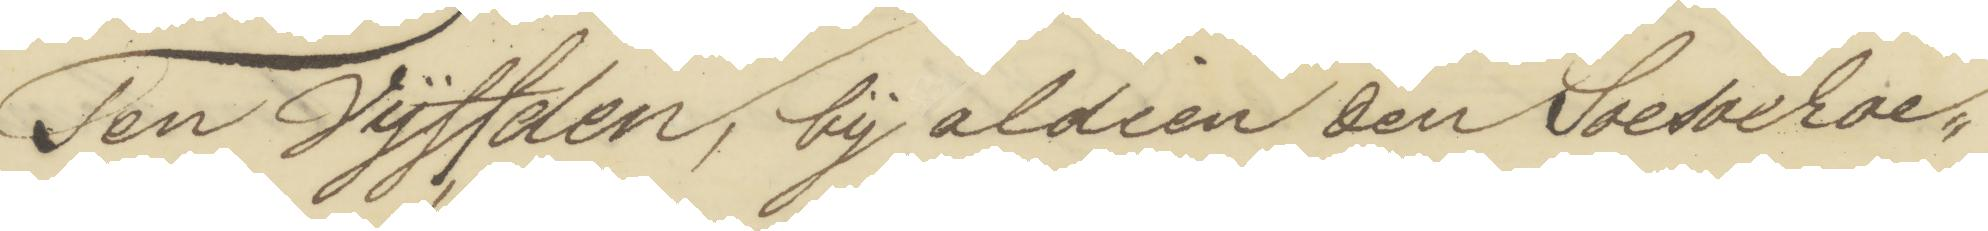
Ten Vijffden, bij aldien den soesoehoe„
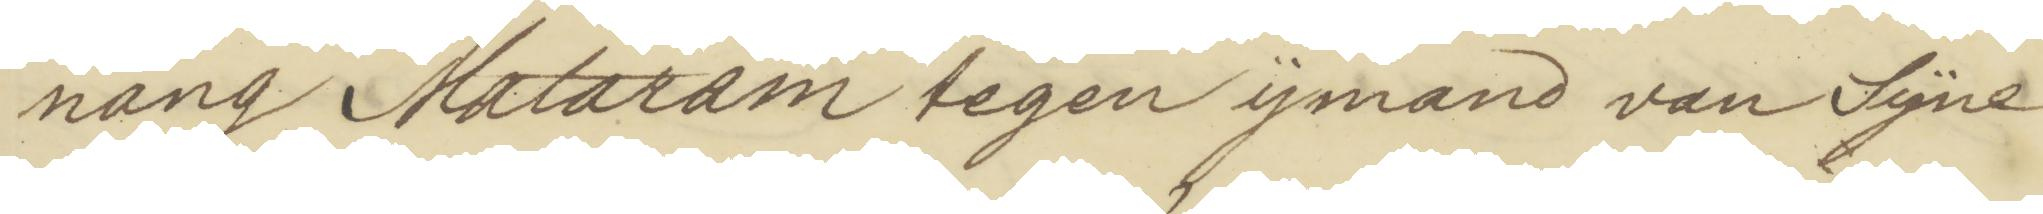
nang Mataram tegen ijmand van sijne
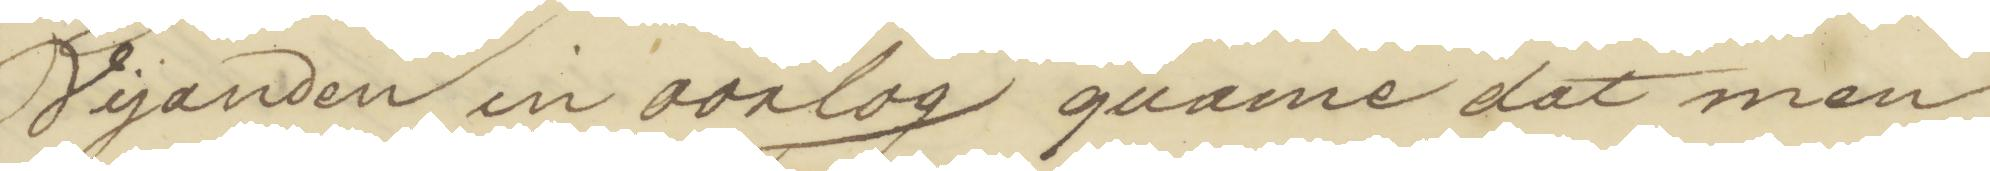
Vijanden in oorlog quame dat men
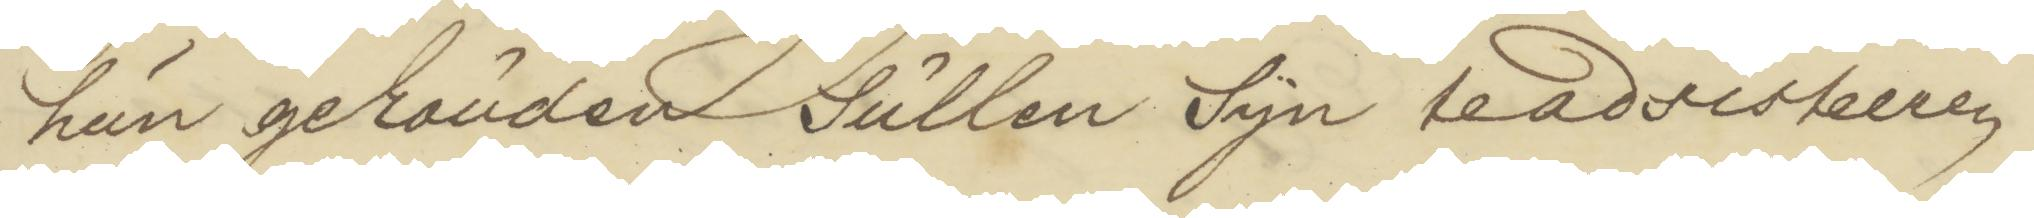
hun gehouden sullen sijn te adsisteeren
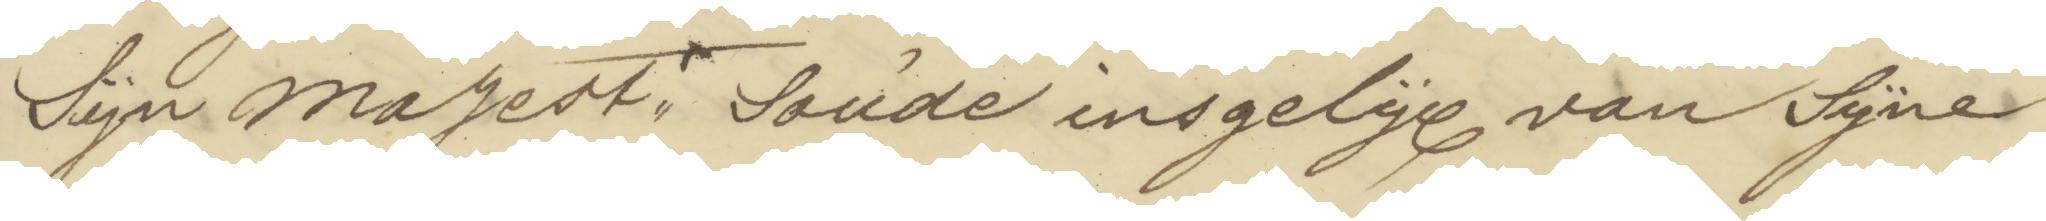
sijn majest„t soude insgelijx van sijne
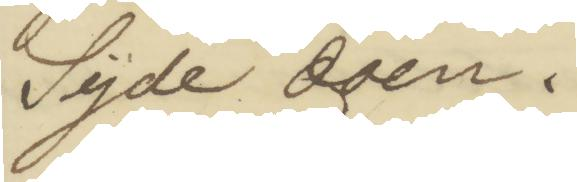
sijde doen.
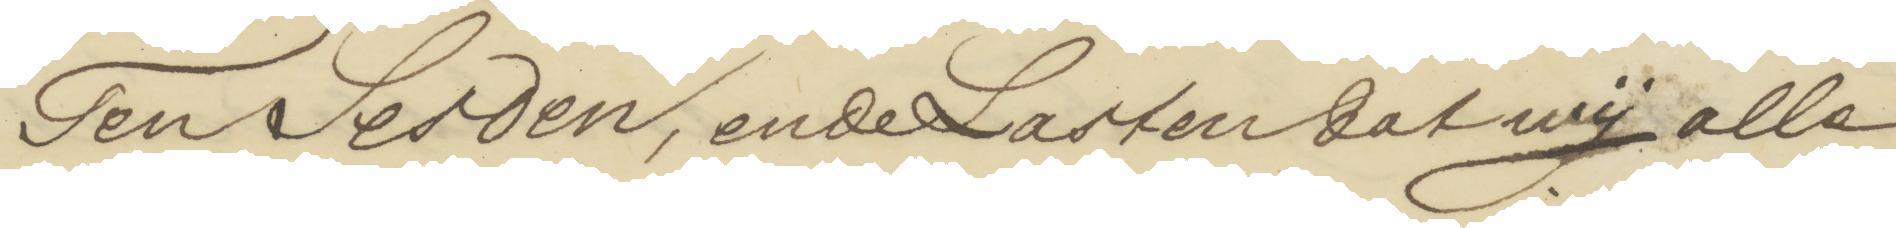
Ten Sesden, ende Lasten dat wij alle
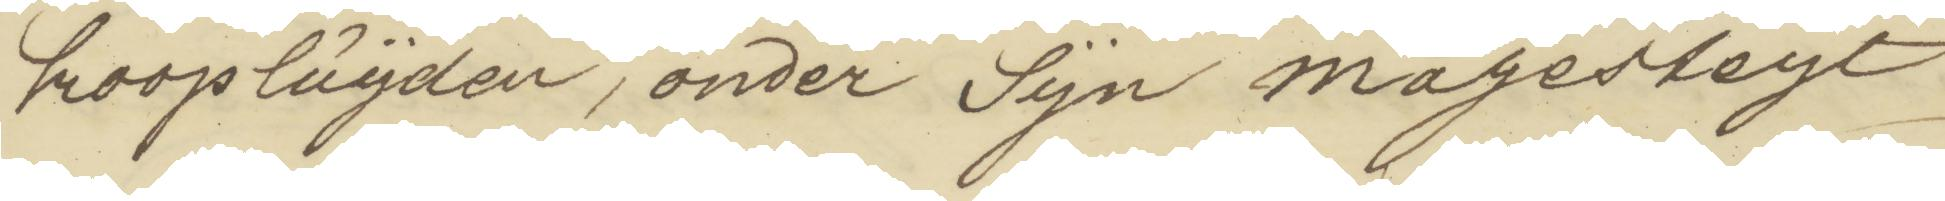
koopluijden, onder sijn majesteijt
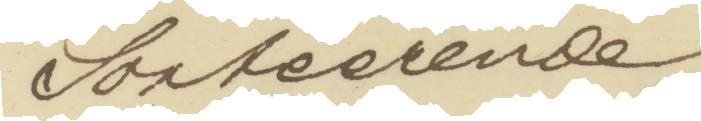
sorteerende
